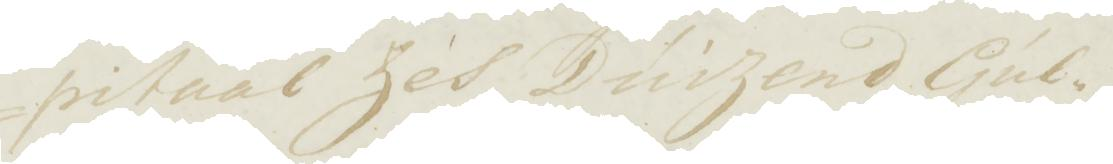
=pitaal Zes Duizend Gul„
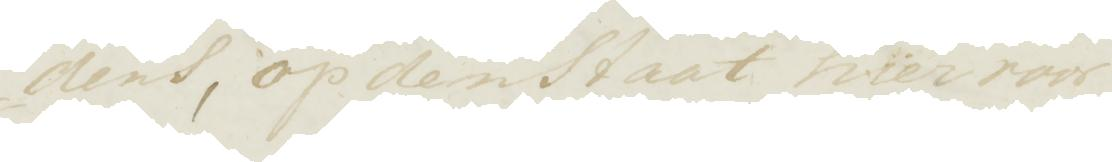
=dens, op den staat hier voor
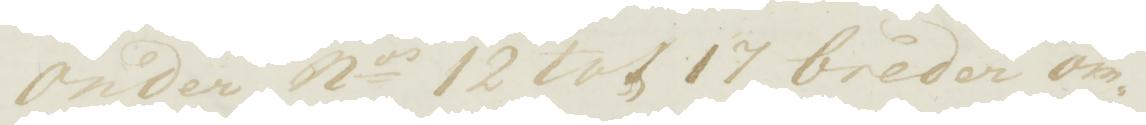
onder N=os 12 tot 17 breder om„
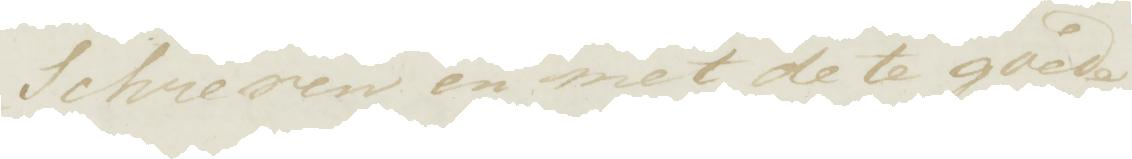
=schreven en met de te goede
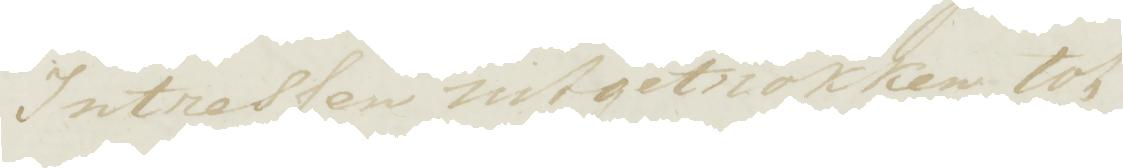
Intressen uitgetrokken tot
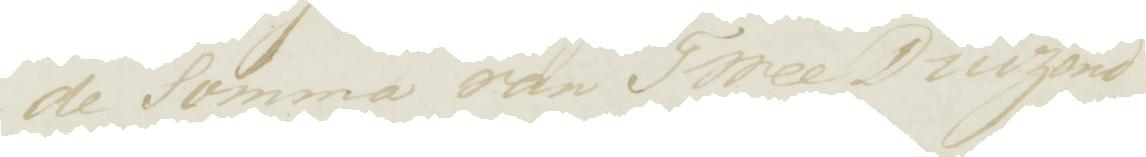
de somma van Twee Duizend
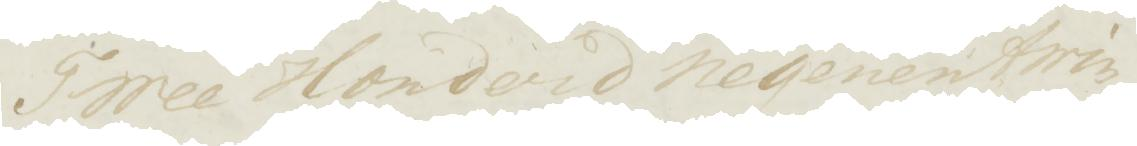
Twee Honderd negenentwin
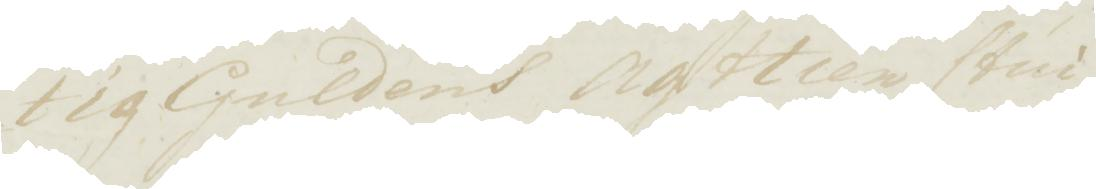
=tig Guldens agttien stui=
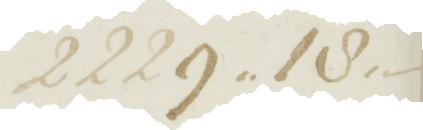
2229 „ 18 „ -
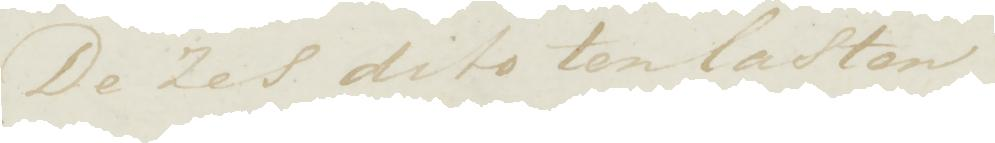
De Zes dito ten lasten
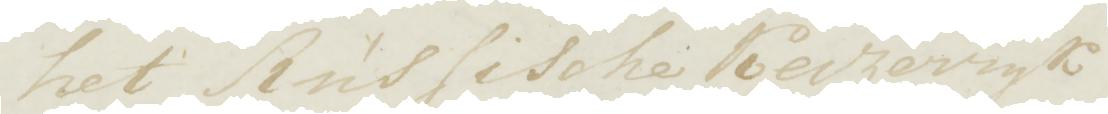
het Russische Keizerryk
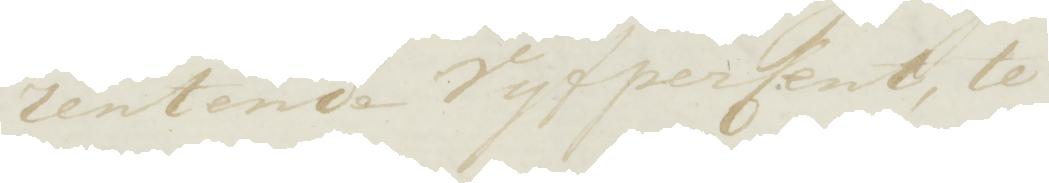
rentende Vijf percent, te
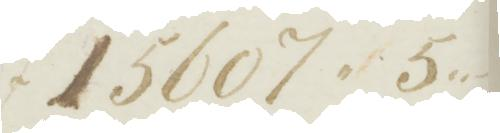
ƒ 15607 „ 5„
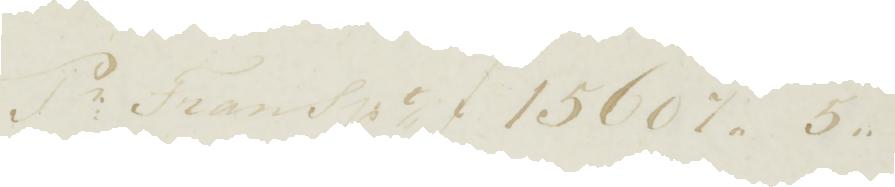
Pr Transp„t ƒ 15607„ 5„
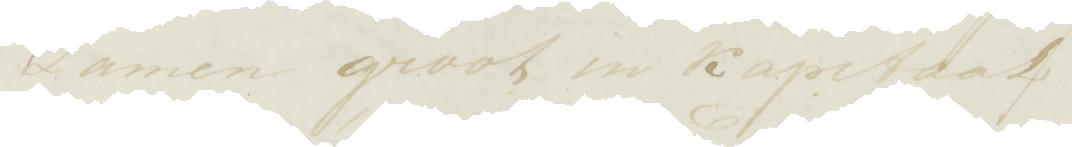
zamen groot in Kapitaal
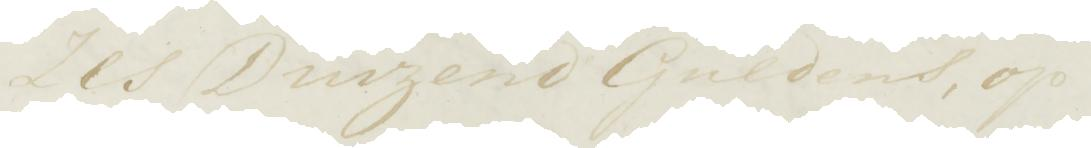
Zes Duizend Guldens, op
